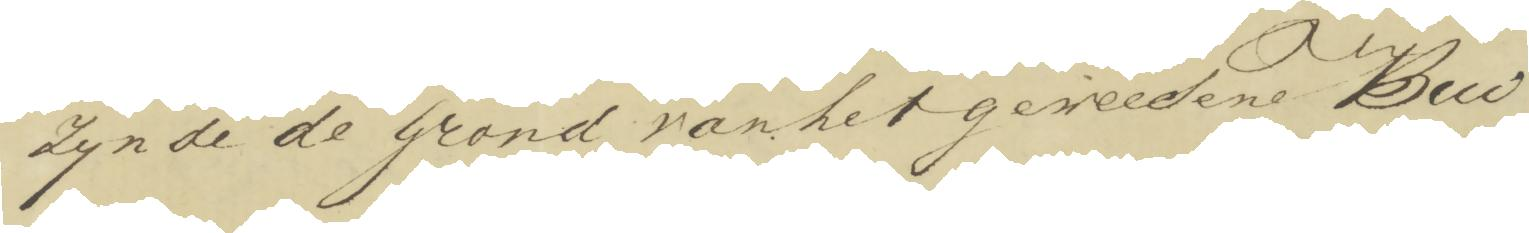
zynde de Grond van het geweesene Bui,
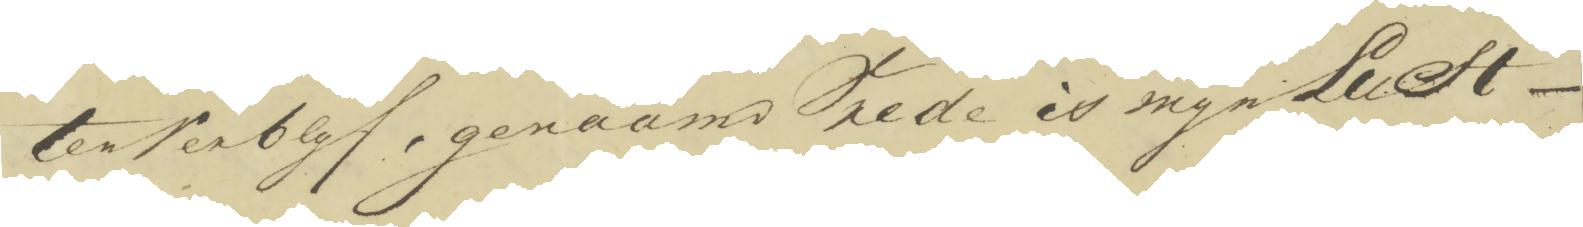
ten verblyf, genaamd Vrede is myn Lust
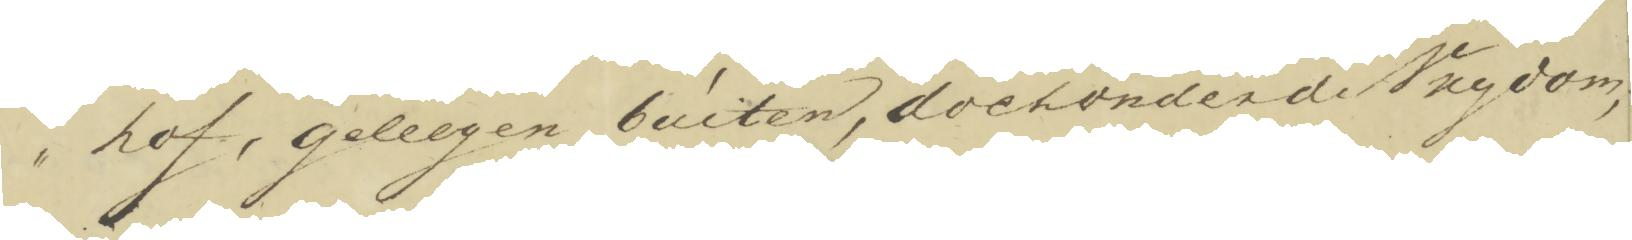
„hof, geleegen buiten, doch onder de Vrydom,
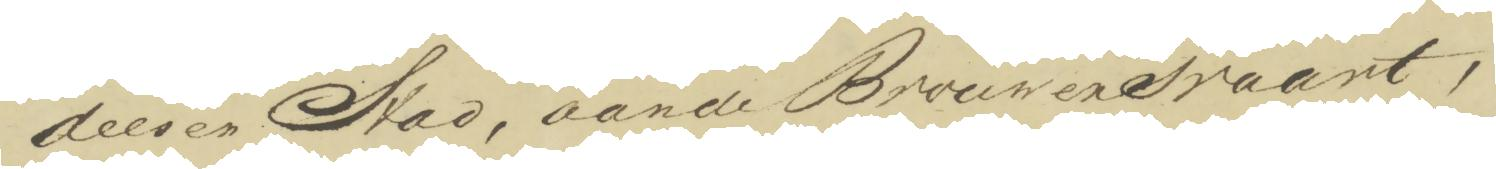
deesen Stad, aan de Brouwersvaart,
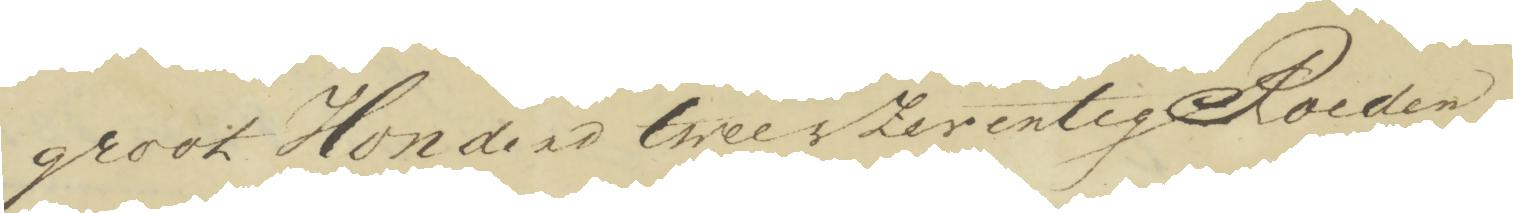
groot Honderd twee en zeventig Roeden
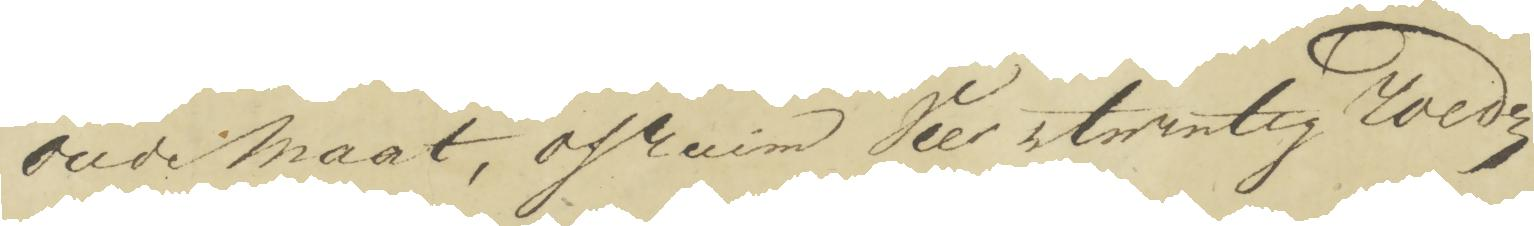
oude maat, of uim Vierentwintig roeden
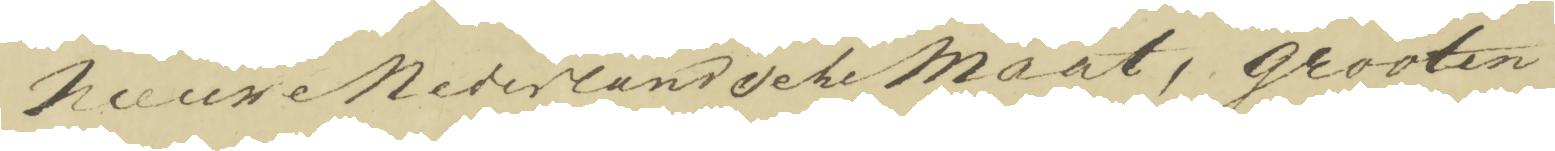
nieuwe Nederlandsche Maat, grooten
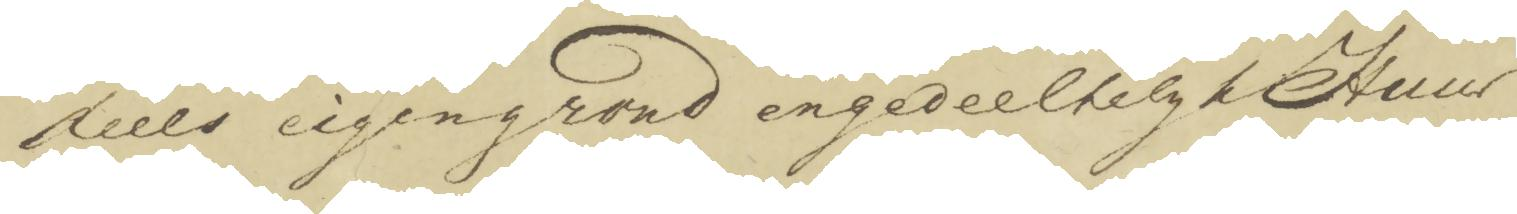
deels eigen grond en gedeeltelyk Huur
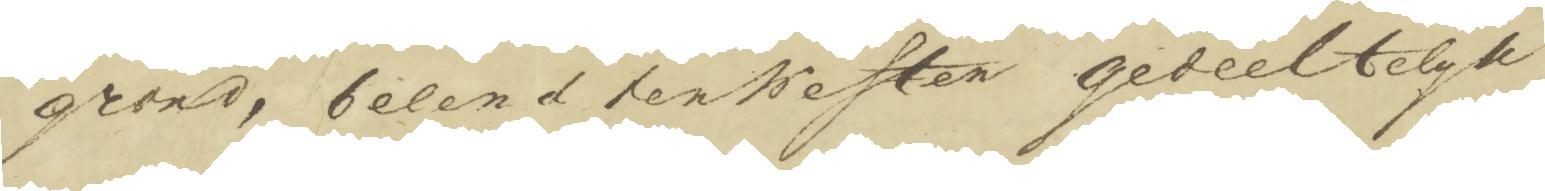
grond, belend ten westen gedeeltelyk
